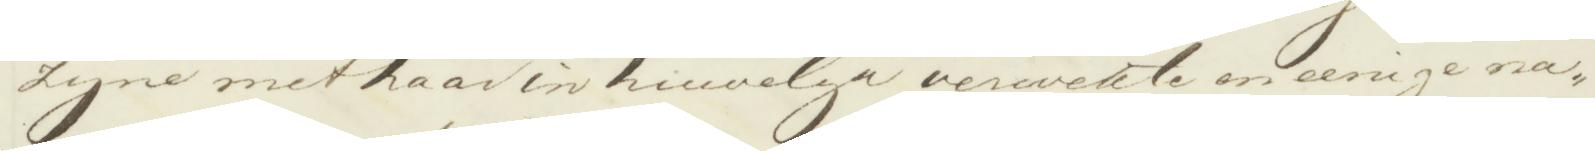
zyne met haar in huwelyk verwekte en eenige na„
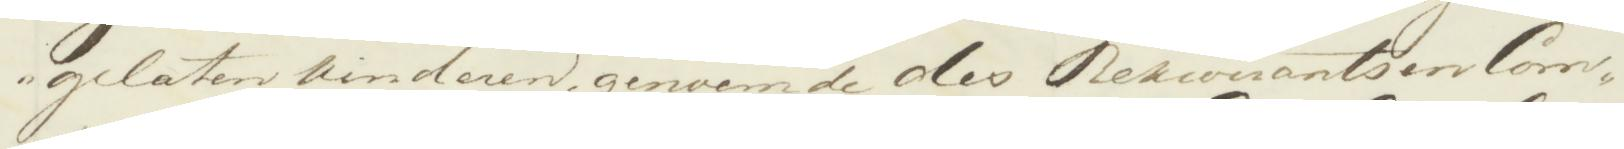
„gelaten kinderen, genoemde des Rekwirants en Com„
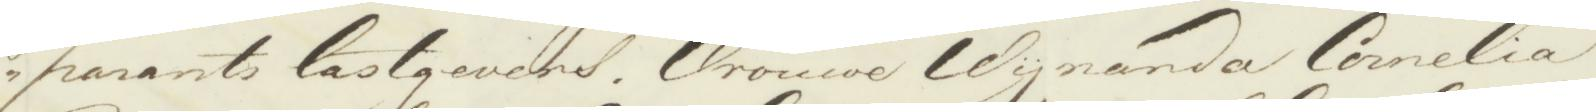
„parants lastgevers, Vrouwe Wijnanda Cornelia
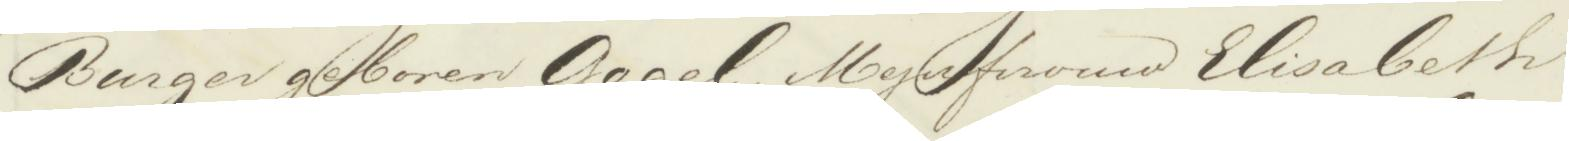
Burger geboren Gogel, Mejufvrouw Elisabeth
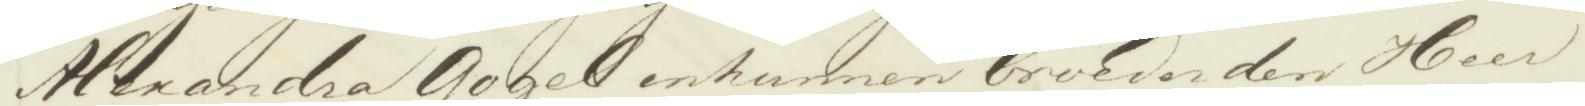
Alexandra Gogel enhunnen broeder den Heer
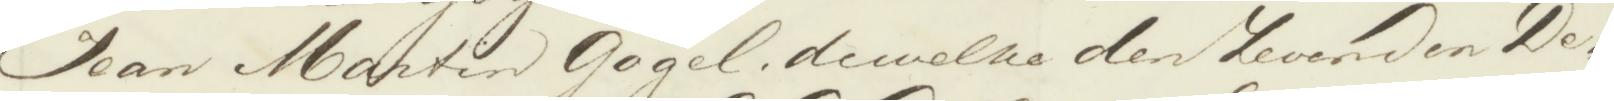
Iean Martin Gogel, dewelke den Zevenden De„
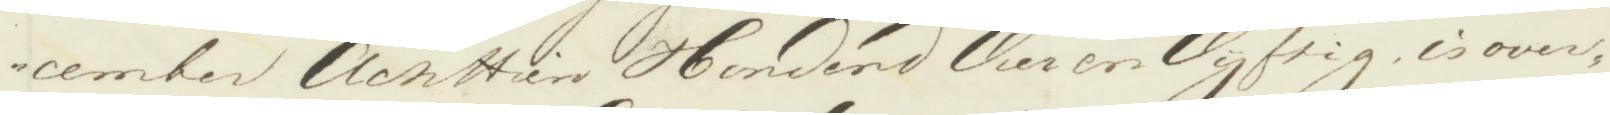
„cember Achttien Honderd Vier en Vijftig, is over„
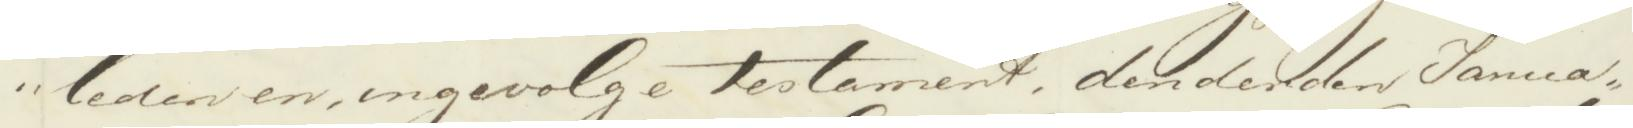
„leden en, ingevolge testament, den derden Ianua„
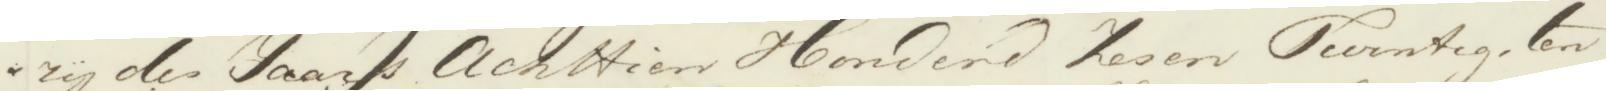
„rij des Iaars Achttien Honderd Zes en Twintig, ten
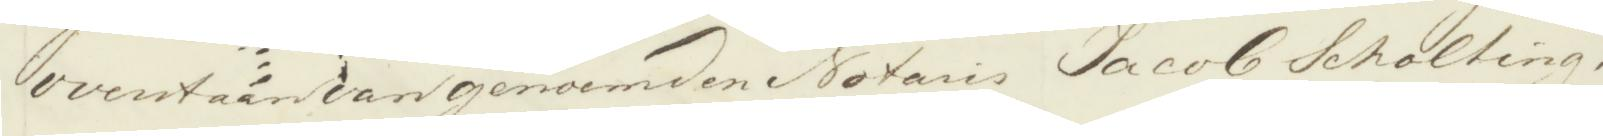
overstaan van genoemden Notaris Iacob Scholting,
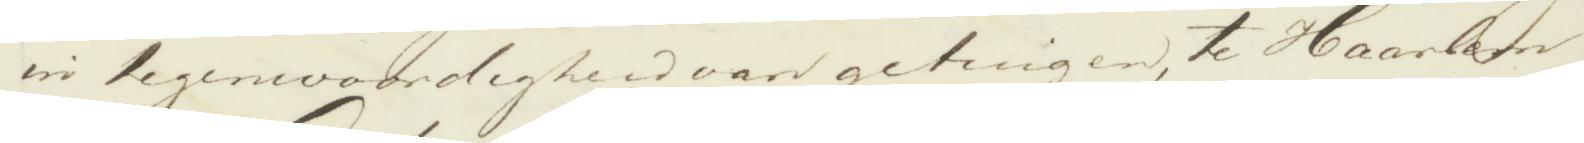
in tegenwoordigheid van getuigen, te Haarlem
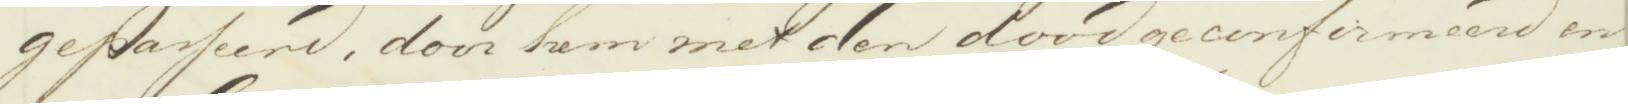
gepasseerd, door hem met den dood geconfirmeerd en
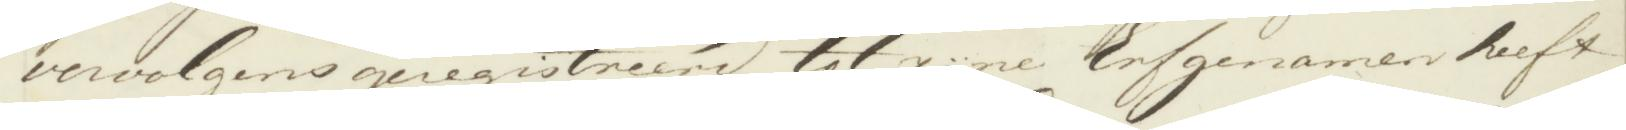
vervolgens geregistreerd, tot zijne Erfgenamen heeft
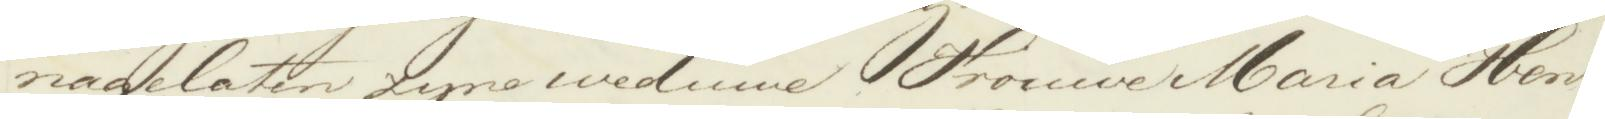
nagelaten zyne weduwe Vrouwe Maria Hen
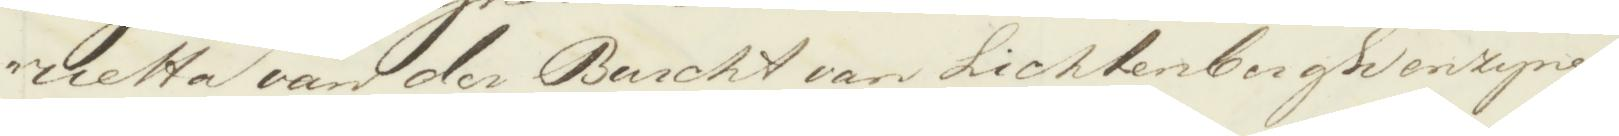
rietta van der Burcht van Lichtenbergh enzyne
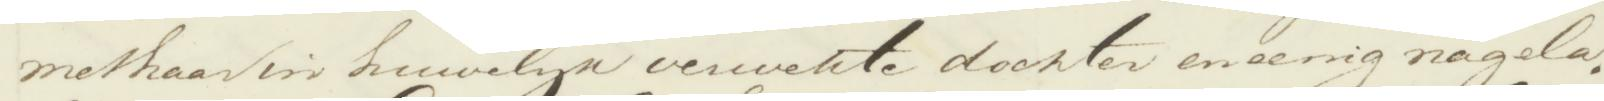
methaar in huwelyk verwekte dochter en eenig nagela„
